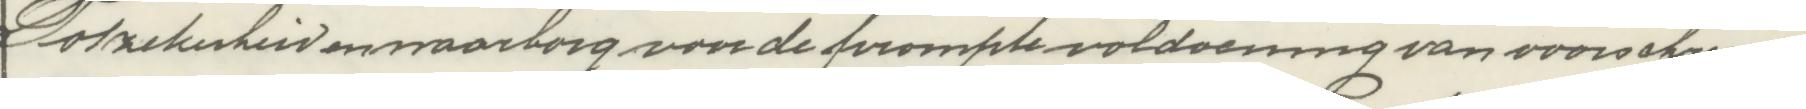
Tot zekerheid en waarborg voor de prompte voldoening van voorschreven
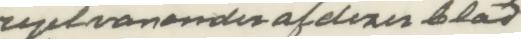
regel van onder af dezer blad
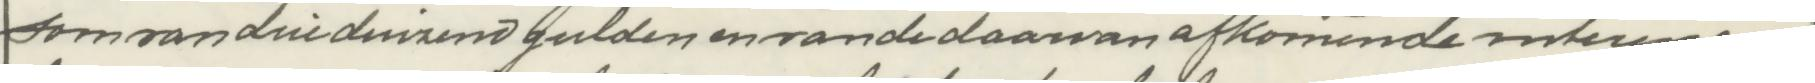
som van drie duizend gulden en van de daarvan afkomende interessen
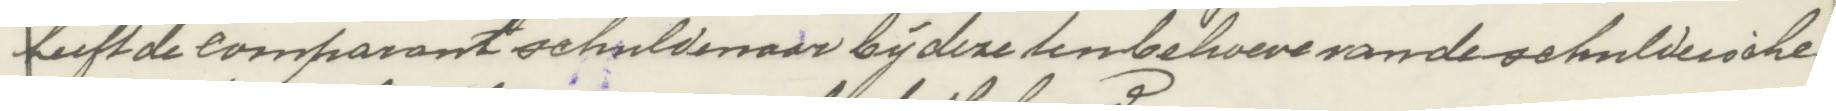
heeft de comparant schuldenaar bij deze ten behoeve van de schuldeische
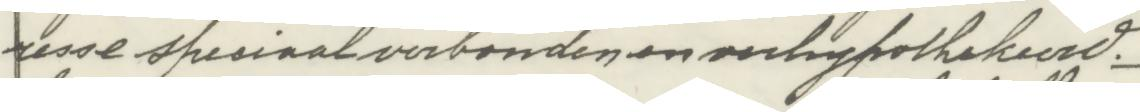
resse speciaal verbonden en verhypothekeerd.
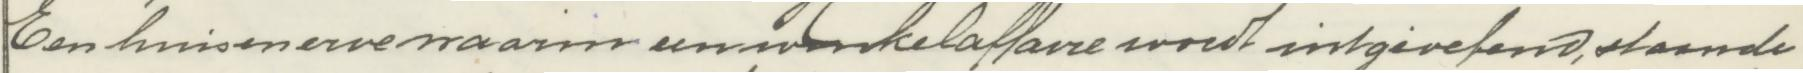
Een huis en erve waarin een winkelaffaire wordt uitgeoefend, staande
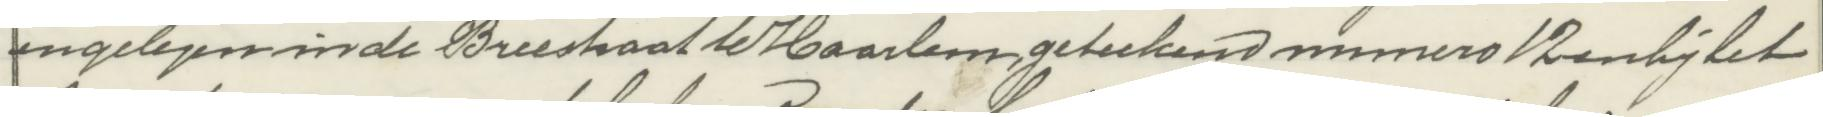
en gelegen in de Breestraat te Haarlem, geteekend numero 12 en bij het
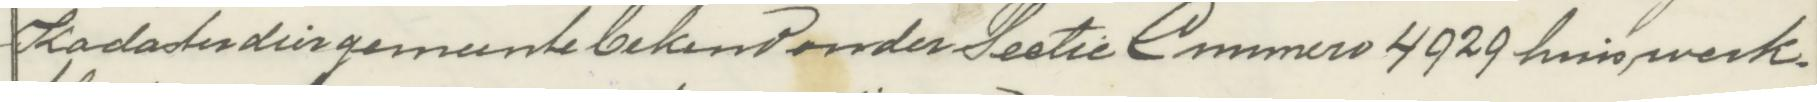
Kadaster dier gemeente bekend onder sectie C numero 4929 huis, werk„
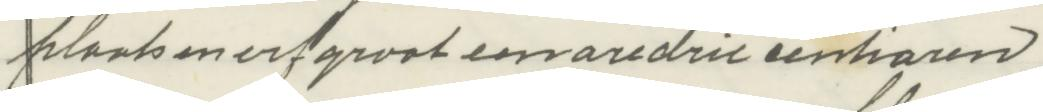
plaats en erf groot een are drie centiaren
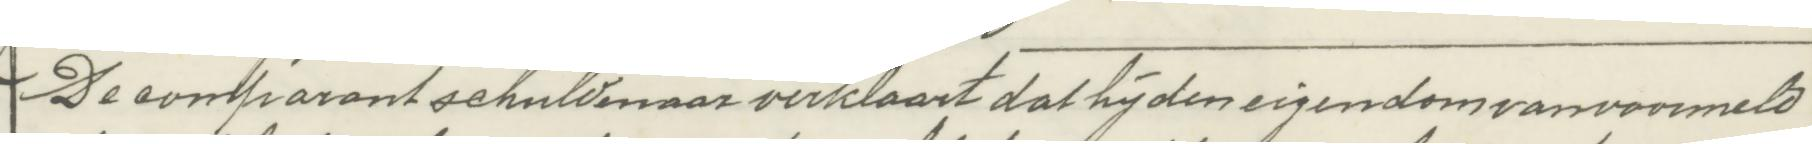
De comparant schuldenaar verklaart dat hij den eigendom van voormeld
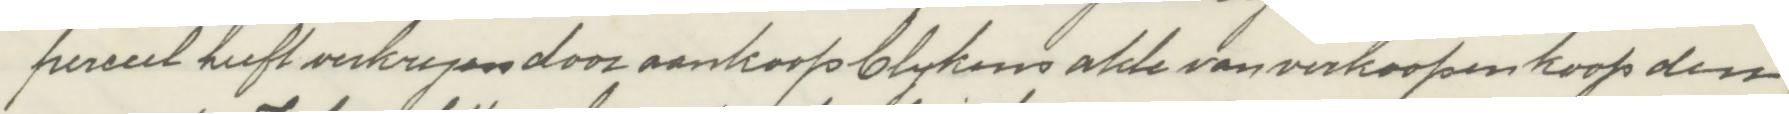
perceel heeft verkregen door aankoop blykens akte van verkoop en koop den
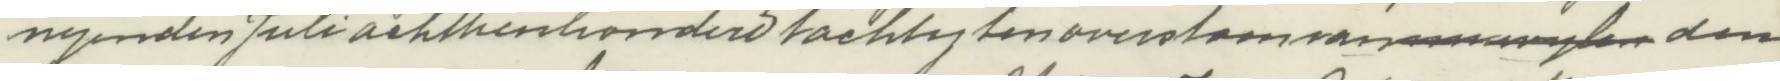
negenden Juli achttienhonderd tachtig ten overstaan van nu wylen den
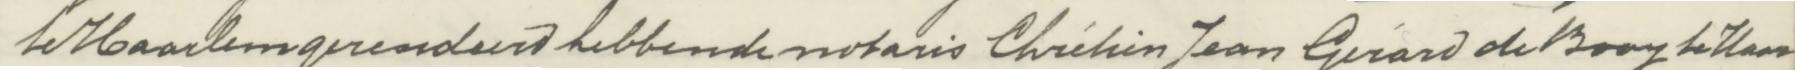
te Haarlem geresideerd hebbende notaris Chrétien Jean Gerard de Booy te Haar
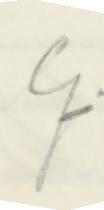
G
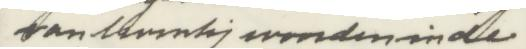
van twintig woorden in de
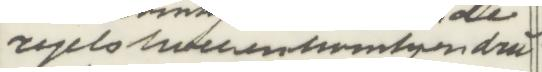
regels tweeentwintig en drie
